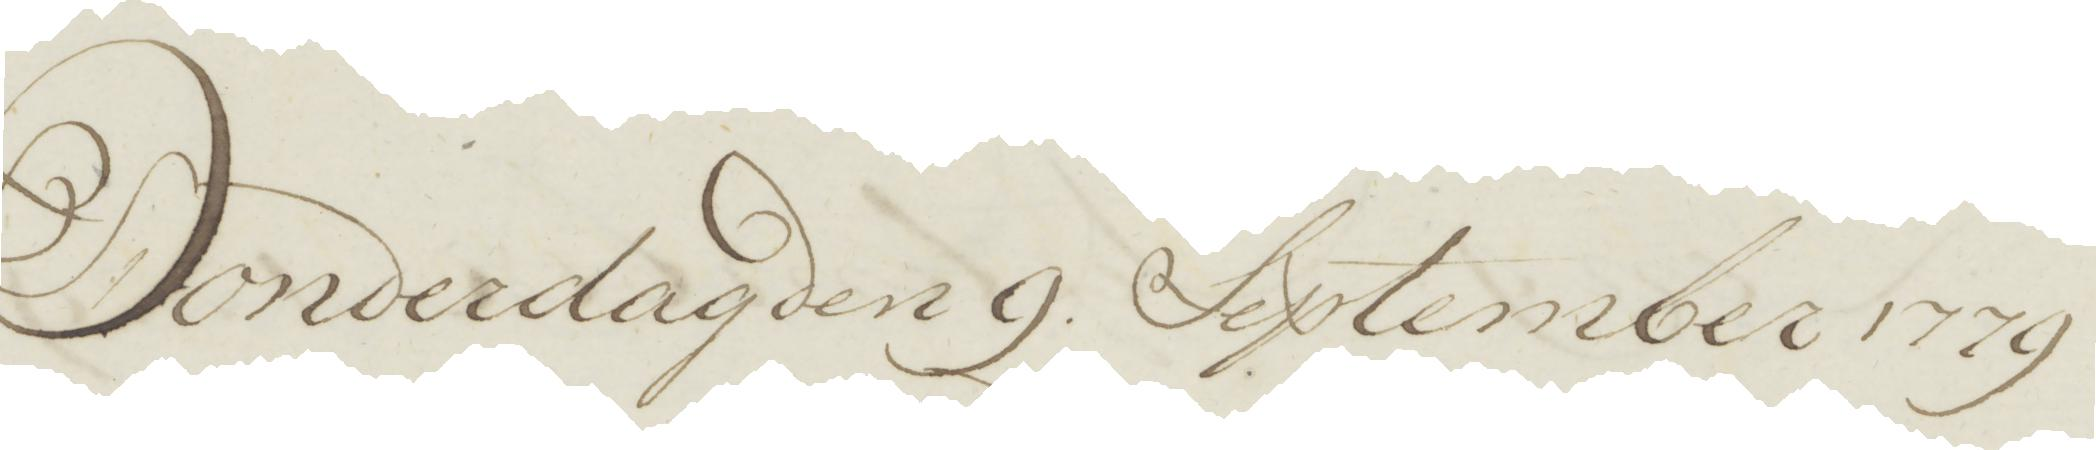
Donderdag den 9. September 1779
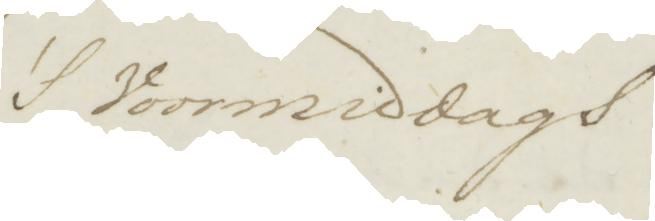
’s voormiddags
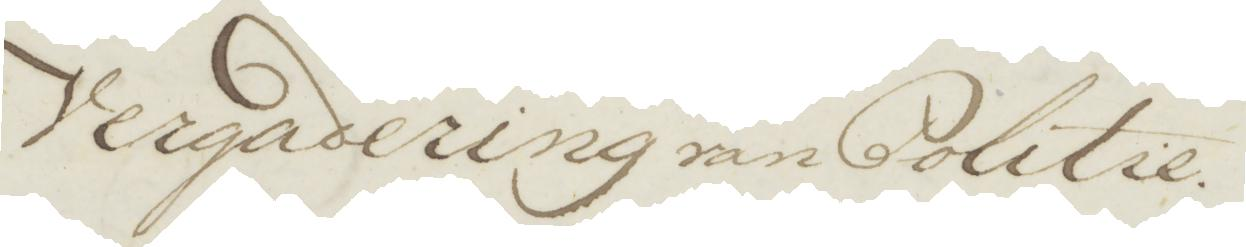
Vergadering van Politie.
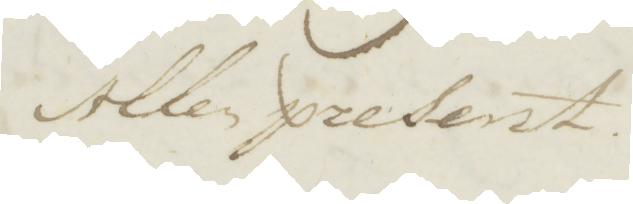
Allen present.
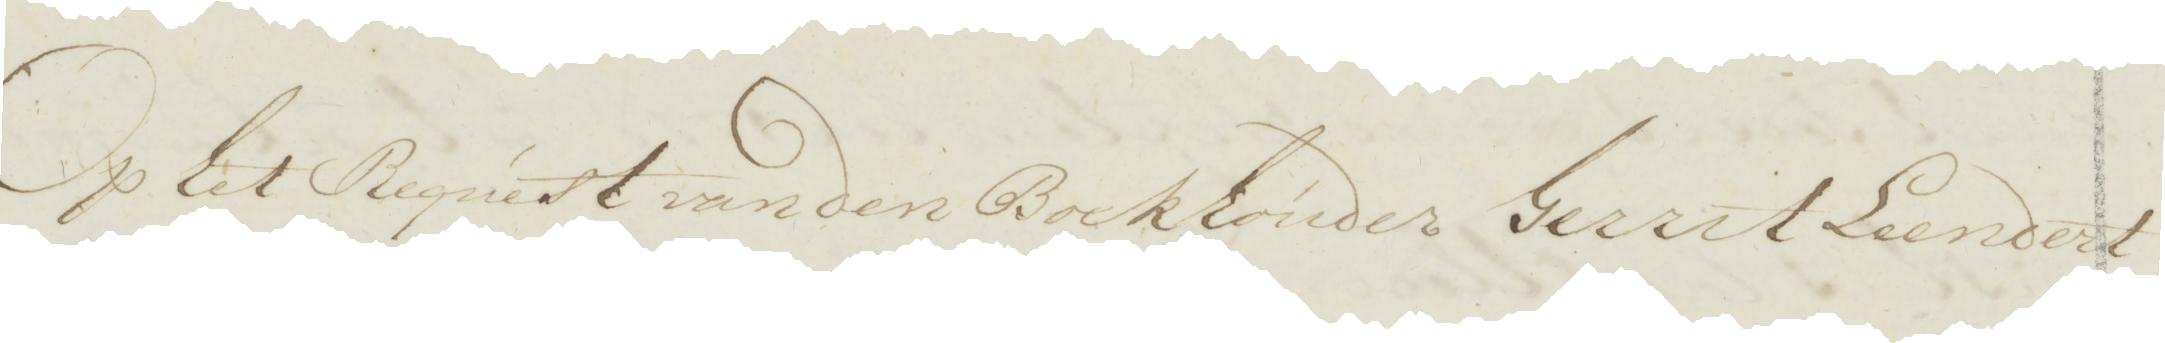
Op het Request van den Boekhouder Gerrit Leendert
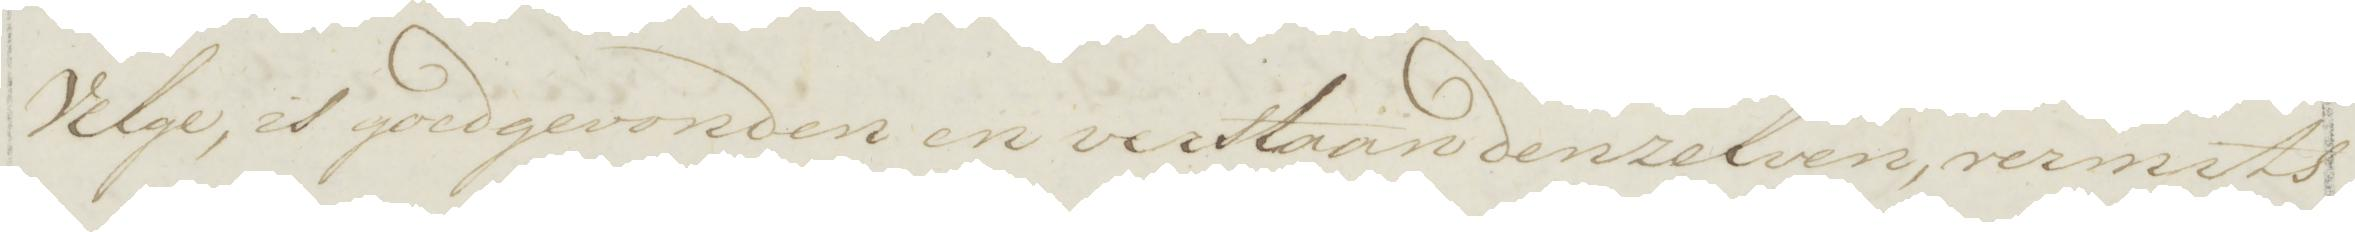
Velge, is goedgevonden en verstaan denzelven, vermits
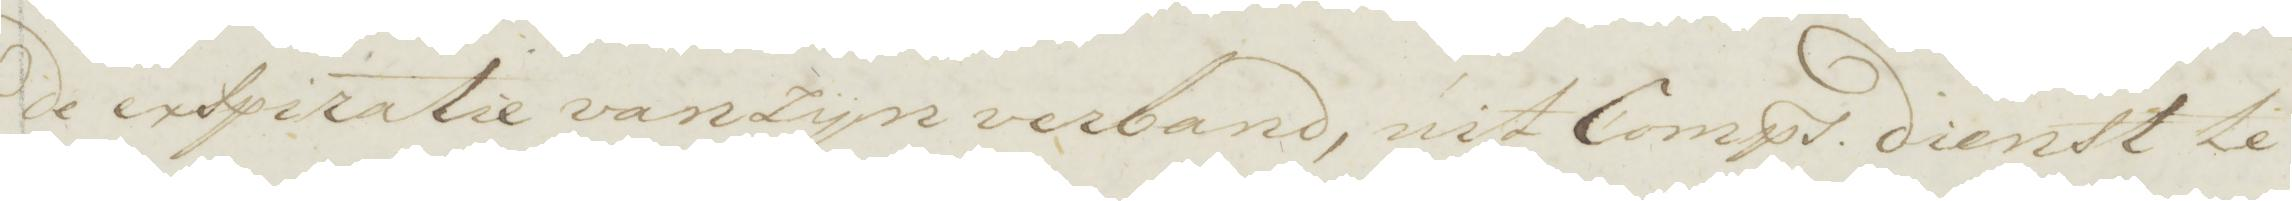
de exspiratie van zijn verband, uit Comps. dienst te
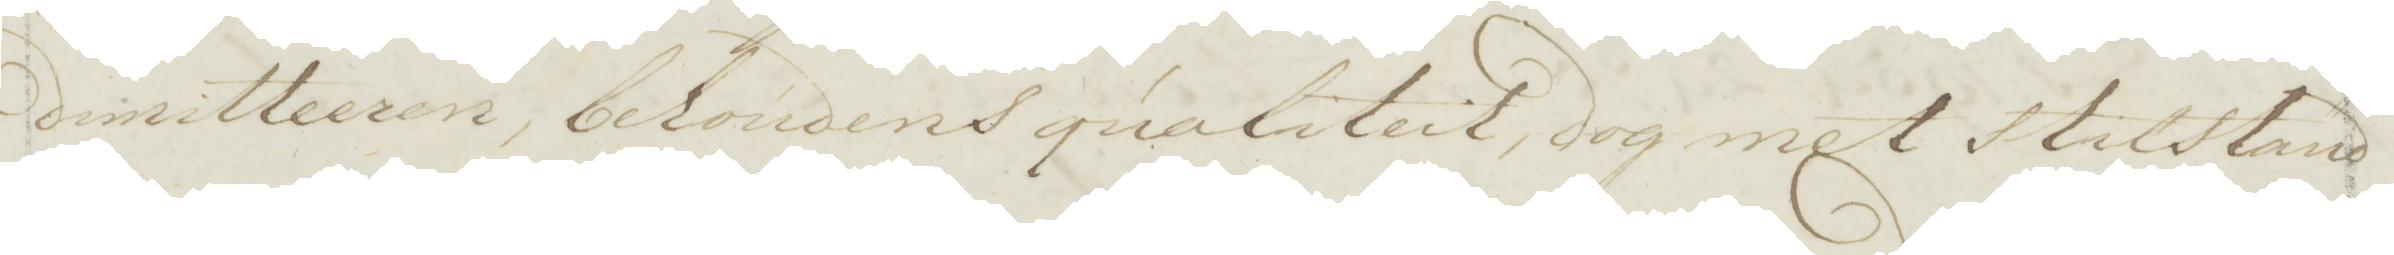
dimitteeren, behoudens qualiteit, dog met stilstand
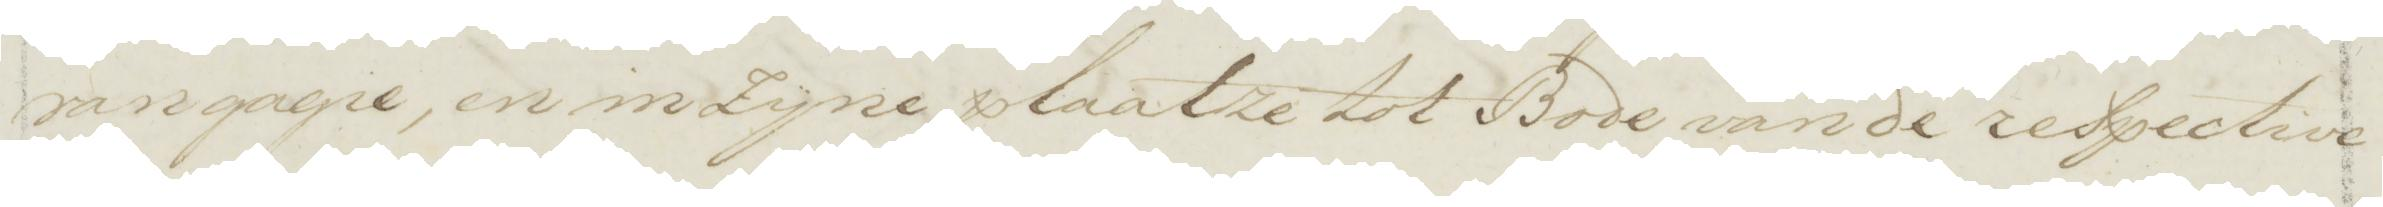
van gagie, en in zijne plaatze tot Bode van de respective
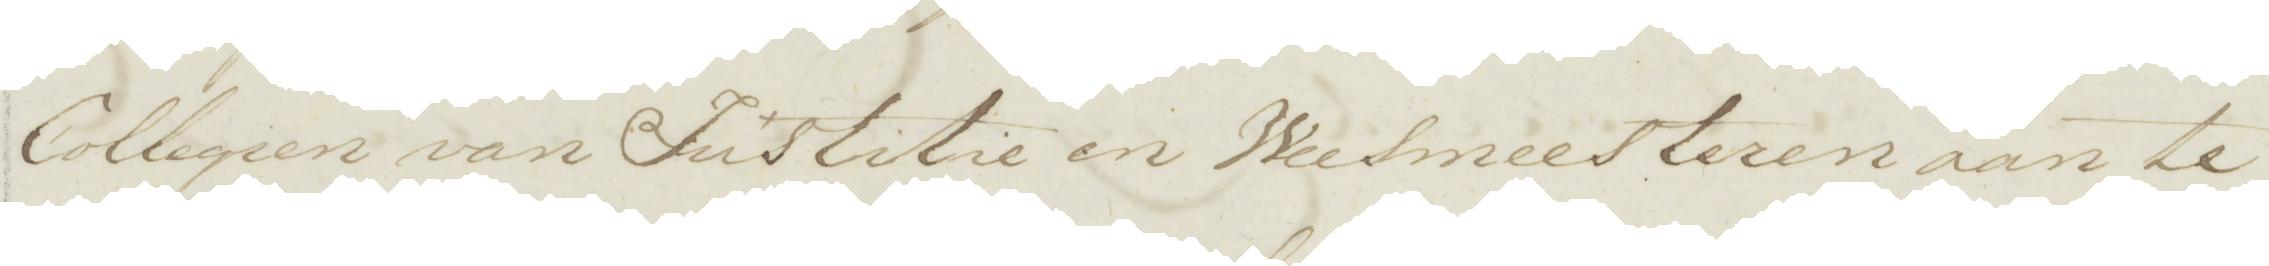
Collegien van Justitie en Weesmeesteren aan te
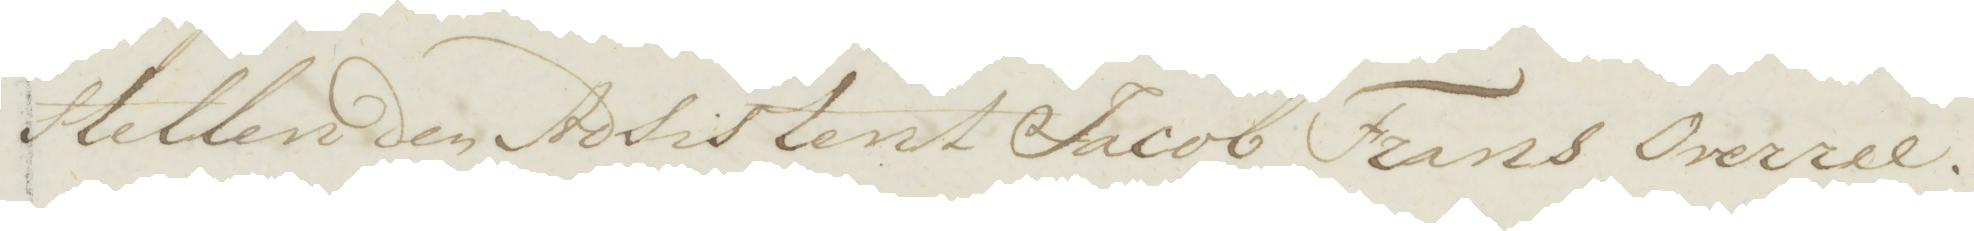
stellen den Adsistent Jacob Frans Overree.
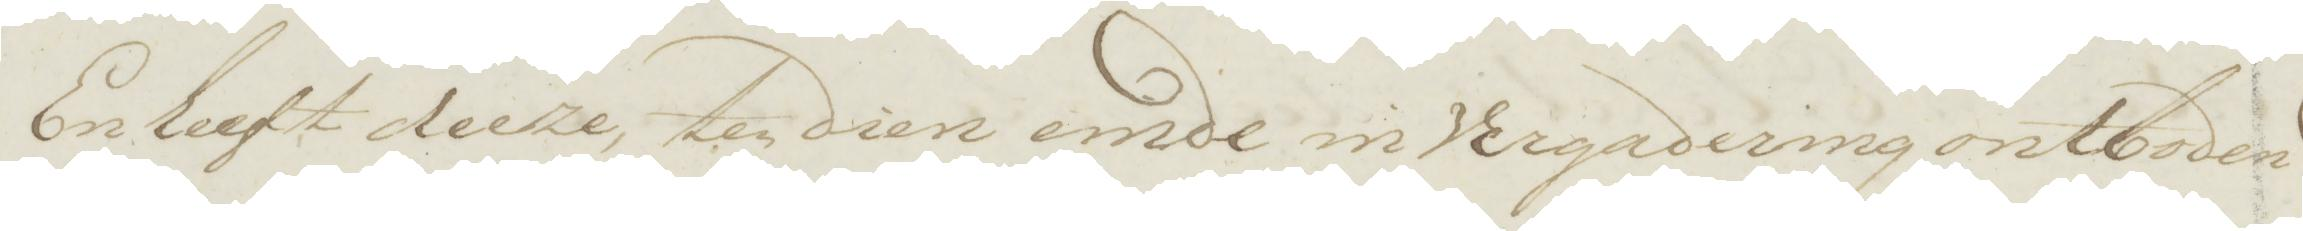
En heeft deeze, ten dien einde in vergadering ontboden
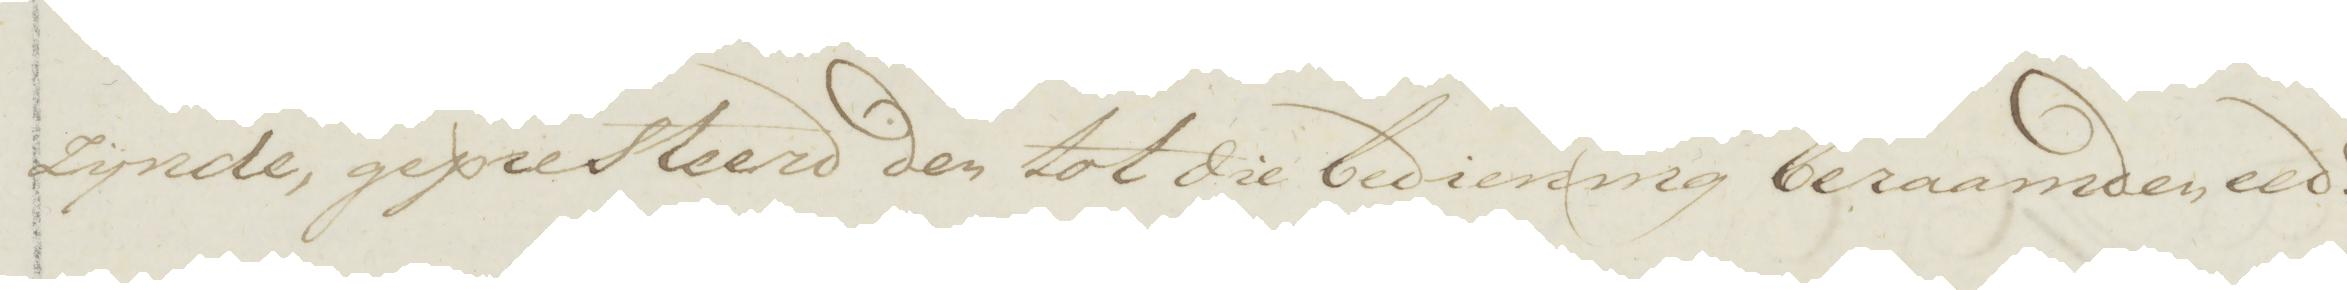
zijnde, gepresteerd den tot die bediening beraamden eed.
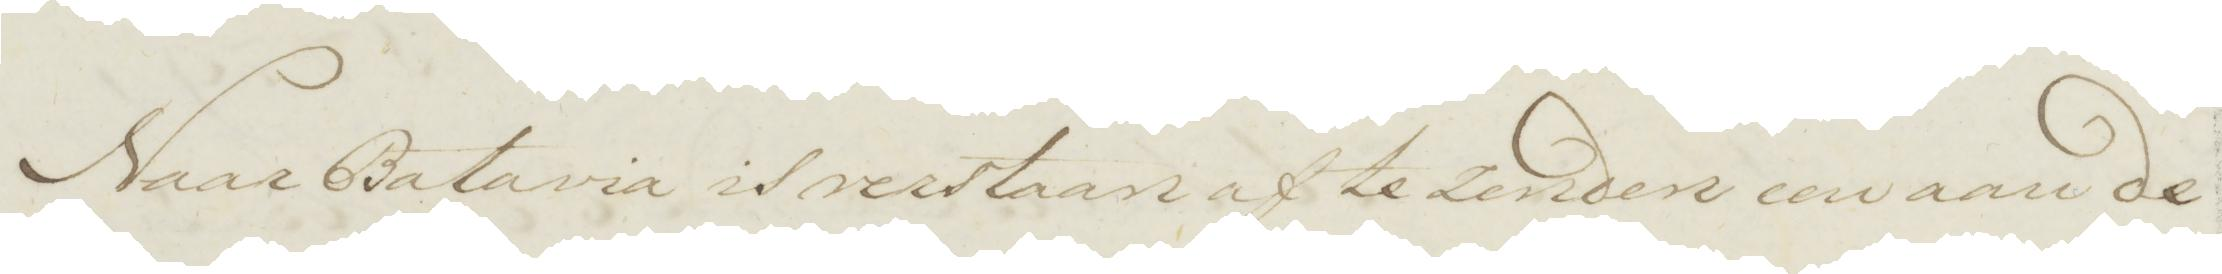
Naar Batavia is verstaan af te zenden een aan de
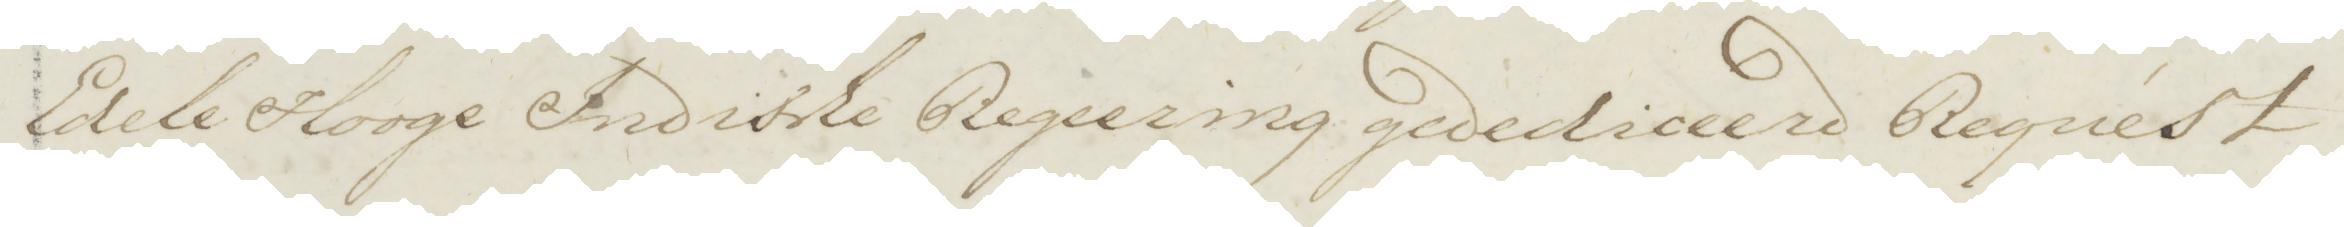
Edele Hooge Indische Regeering gedediceerd Request
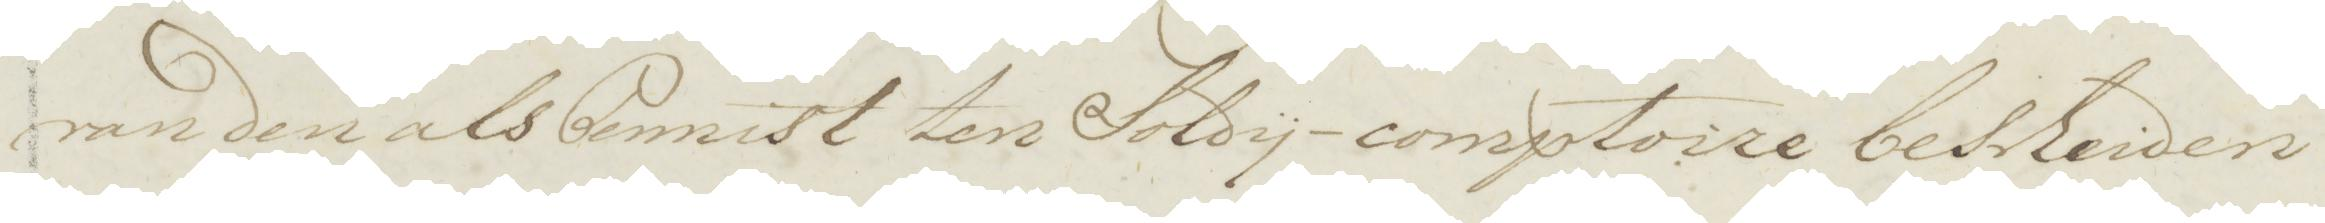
van den als Pennist ten Soldij-comptoire bescheiden
